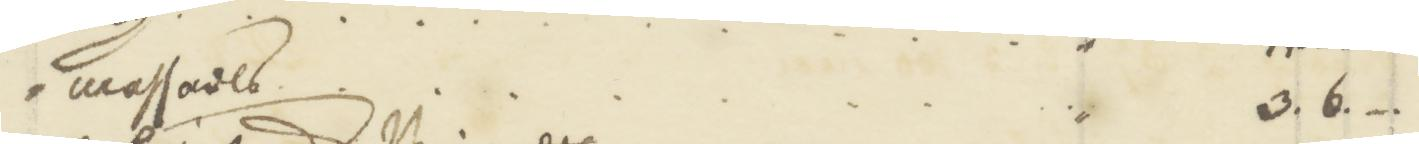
„ massaels . . . . . . . . . . „ 3.6.–.
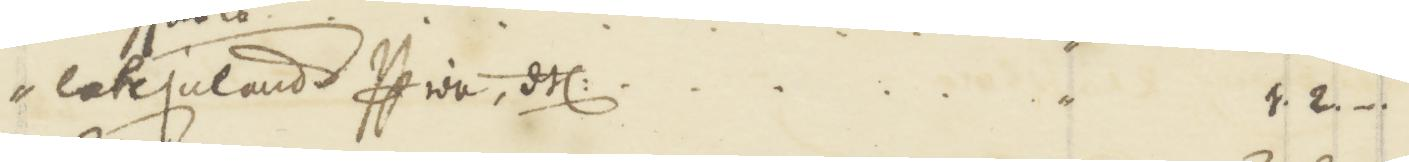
„ lak jnlands ppier, etc: . . . . . . „ 1.2.–.
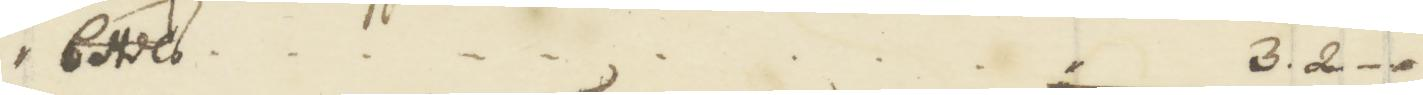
„ betels - - - - - - . . . „ 3.2.–.–
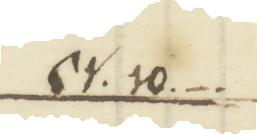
51.10.–.
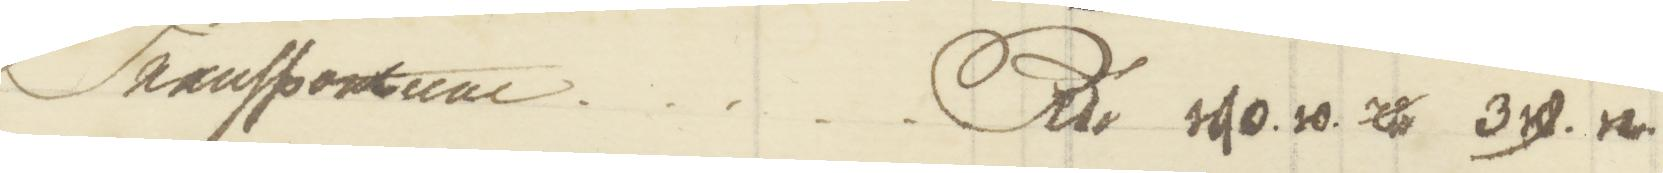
Transporteere Rd„s 140.10. ro/a 318.12.
